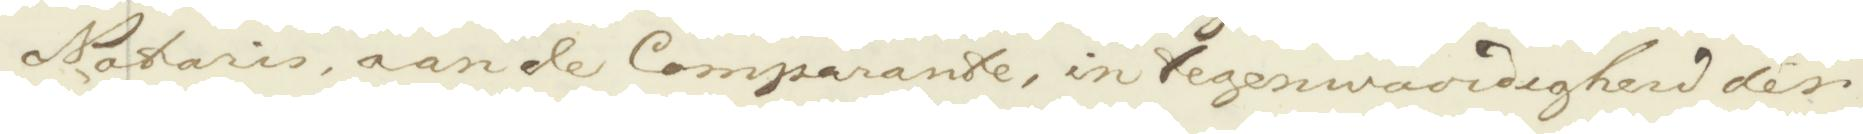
Notaris, aan de Comparante, in tegenwoordigheid der
